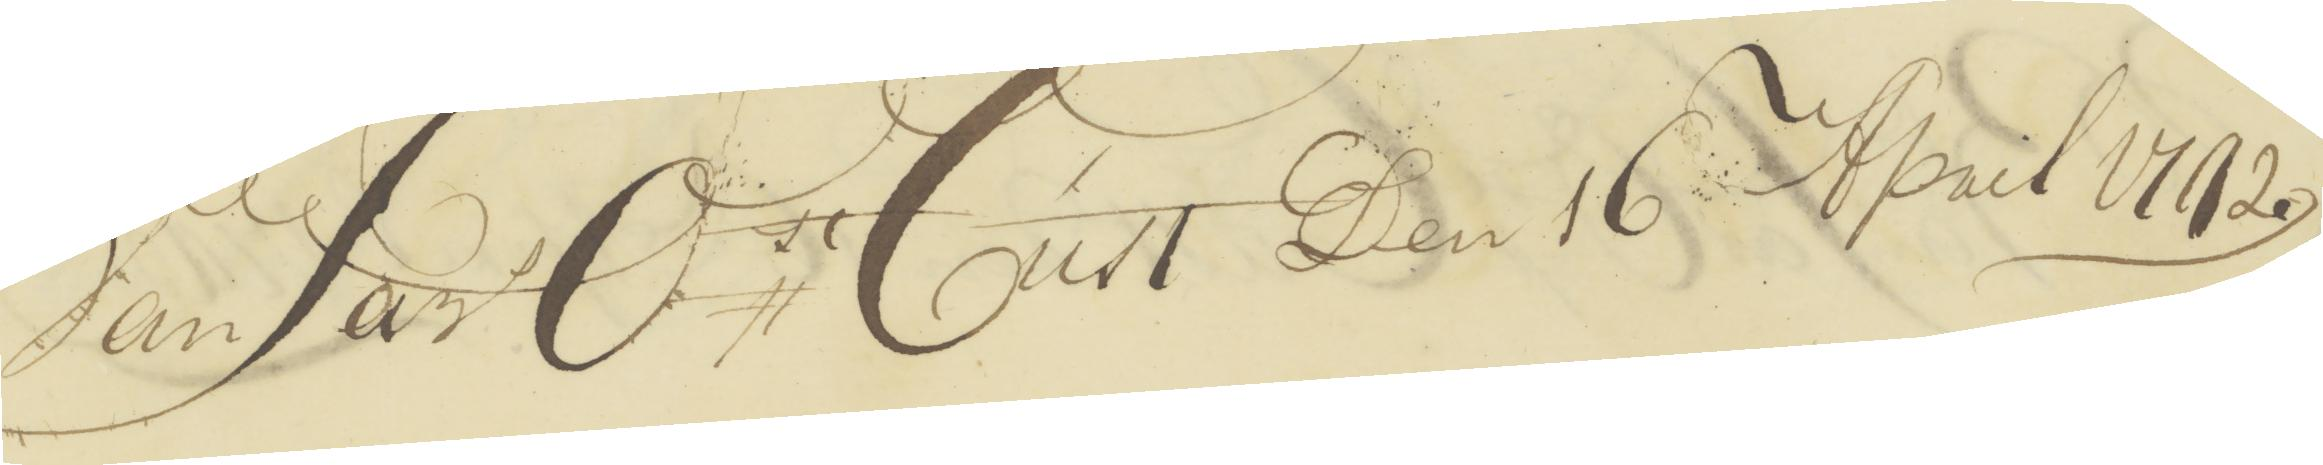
Van Javs O#st Cust Den 16n April 1742.,
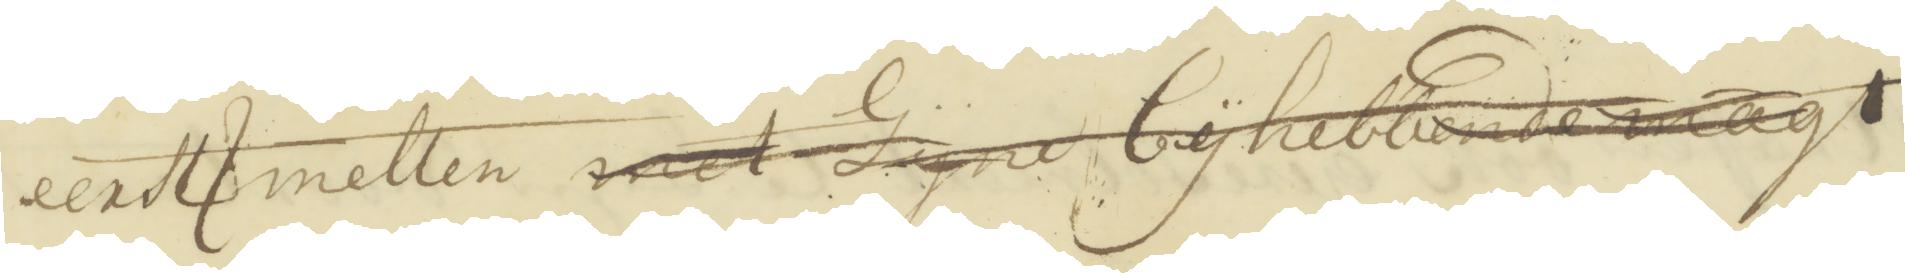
eerstvermelten met zijne bijhebbende magt
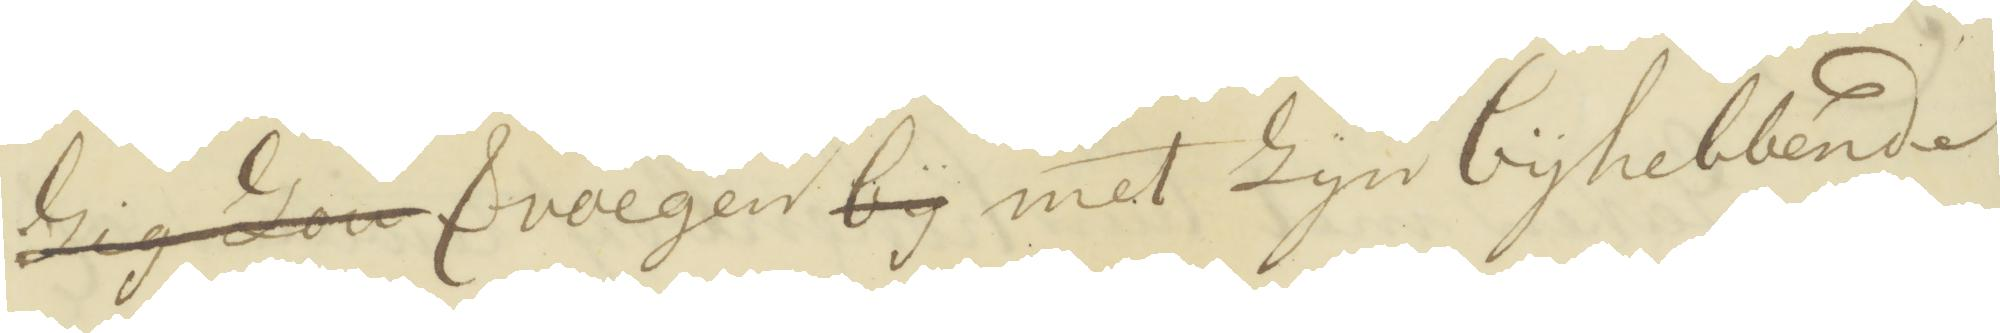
zig zou vervoegen bij met zijn bijhebbende
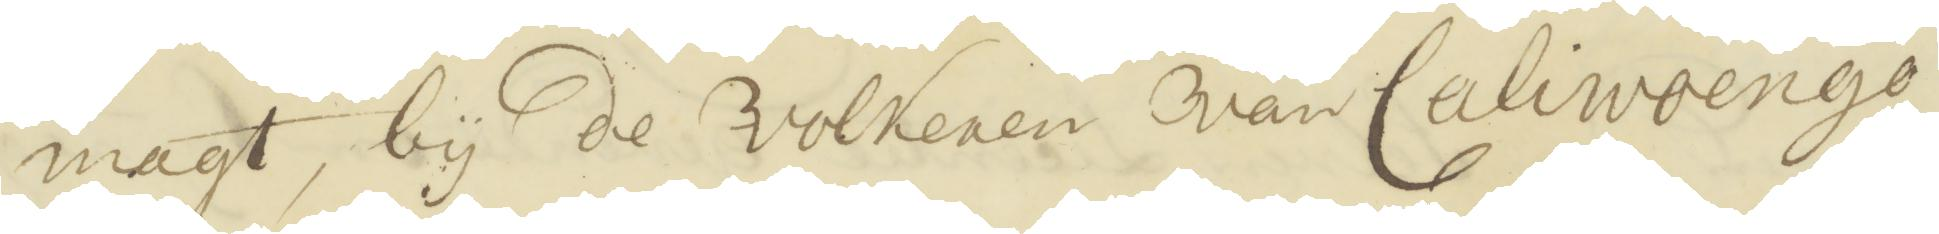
magt, bij de volkeren van Caliwoengo
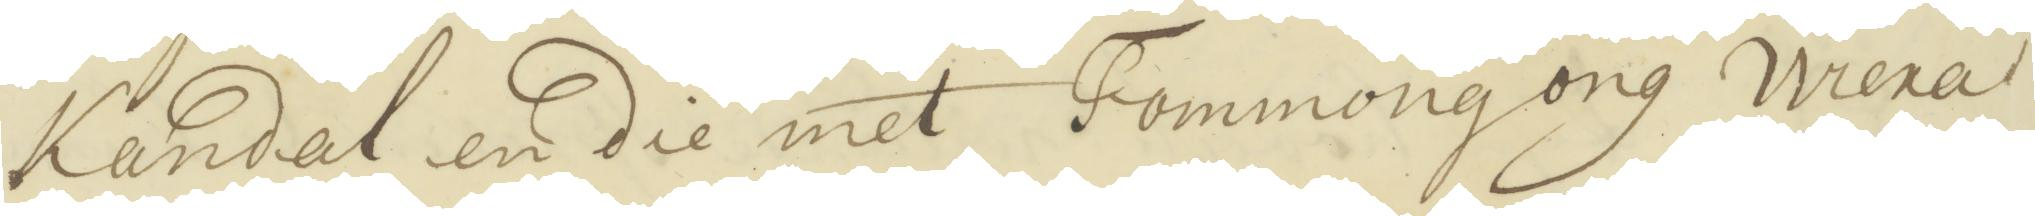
Kandal en die met Tommongong wiera
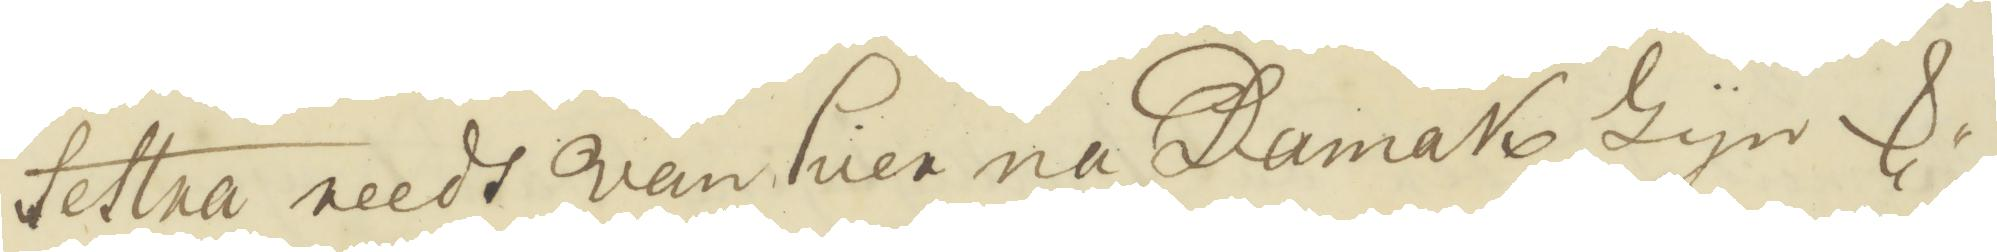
sestra reeds van hier na Damak zijn ver„
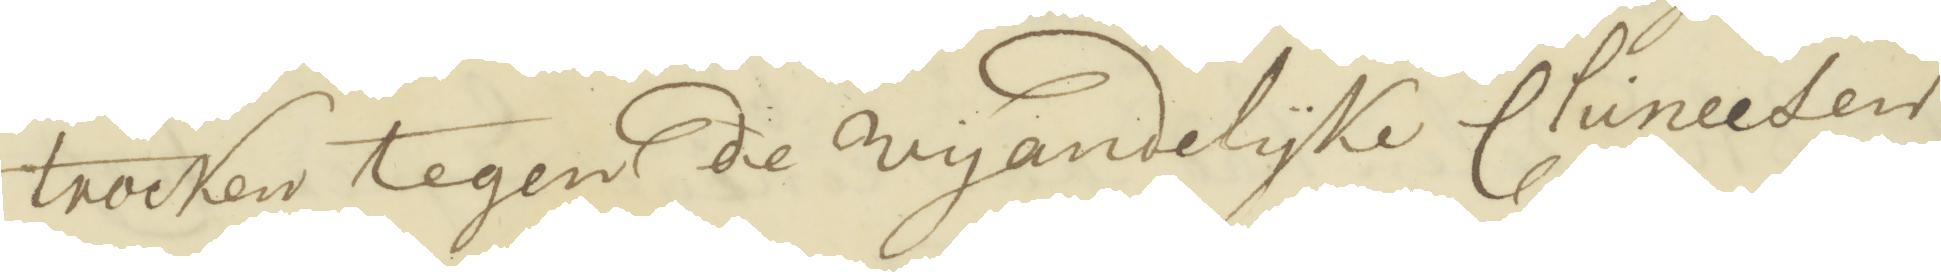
trocken tegen de vijandelijke Chineesen
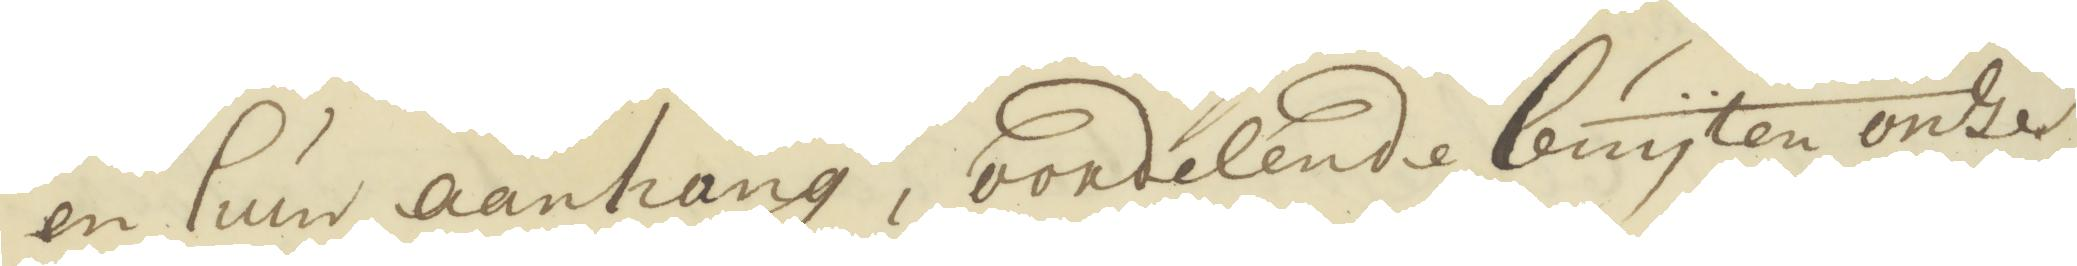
en hun aanhang, oordelende buijten onze
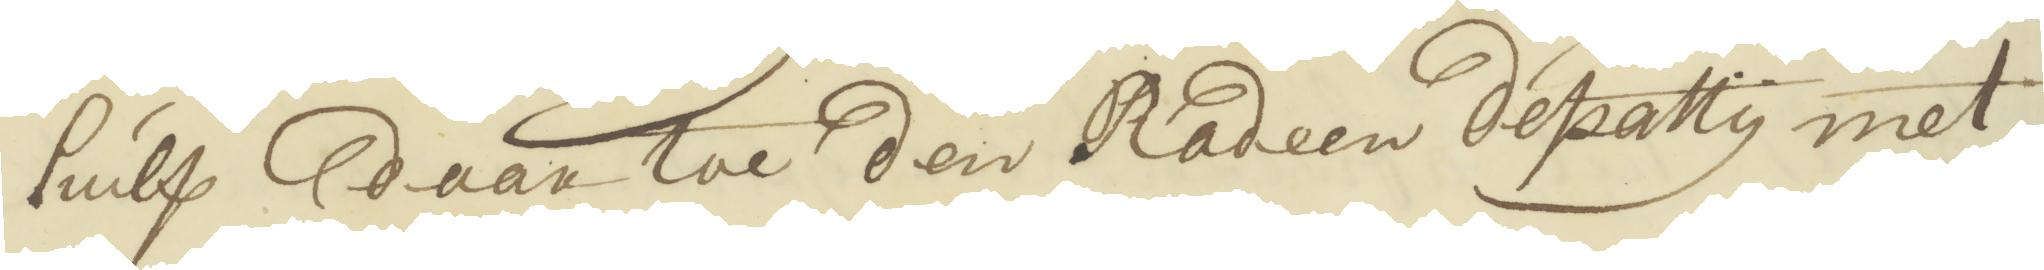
hulp daar toe den Radeen depattij met
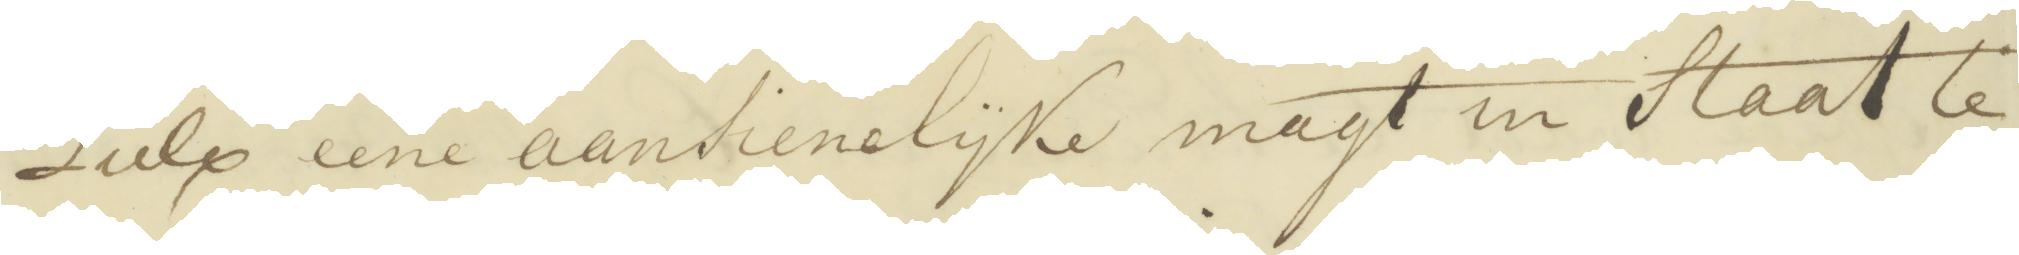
zulx eene aansienelijke magt in staat te
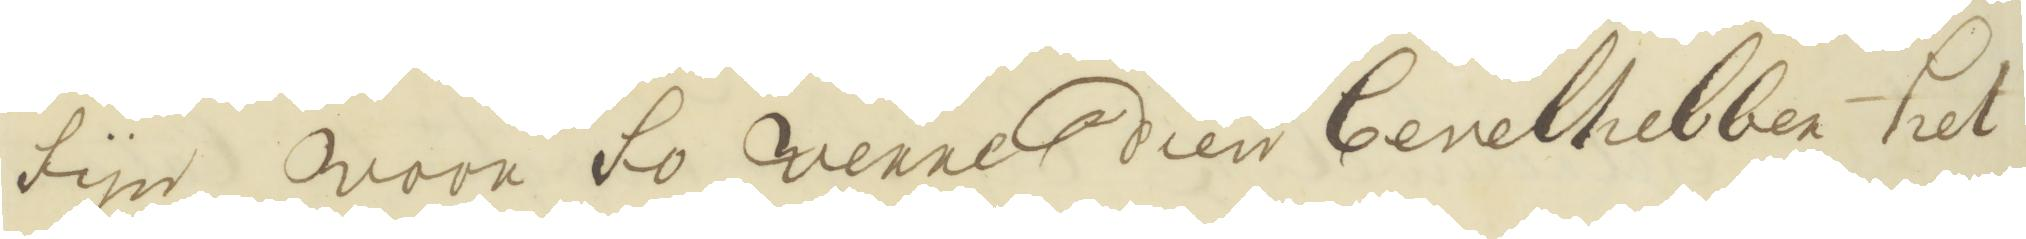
sijn voor so verre dien bevelhebber het
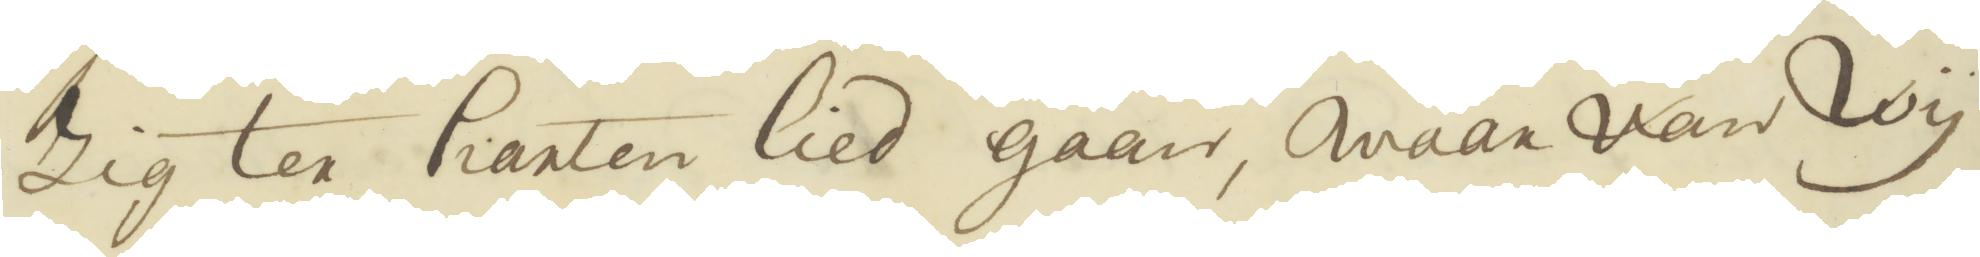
zig ter harten lied gaan, waar van wij
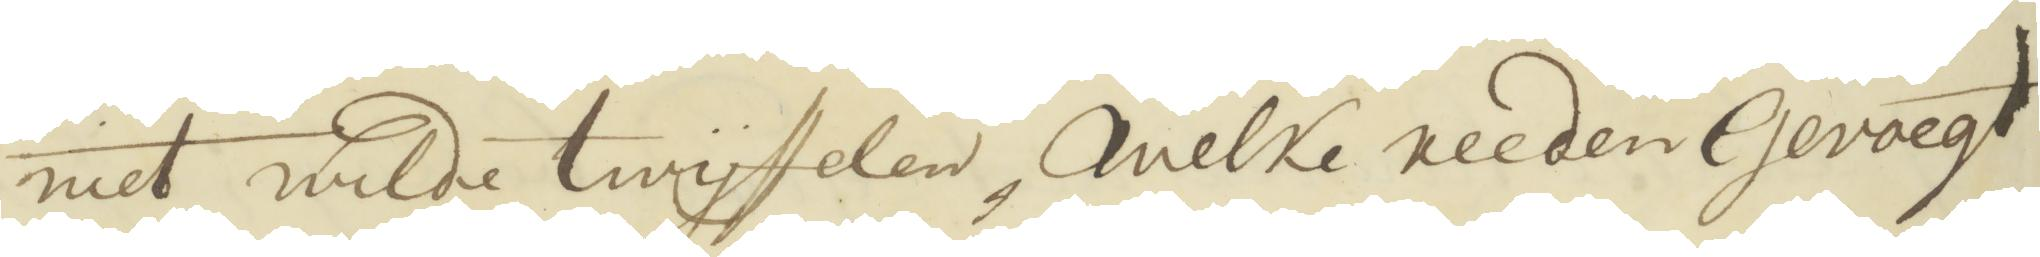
niet wilde twijffelen, welke reeden gevoegt
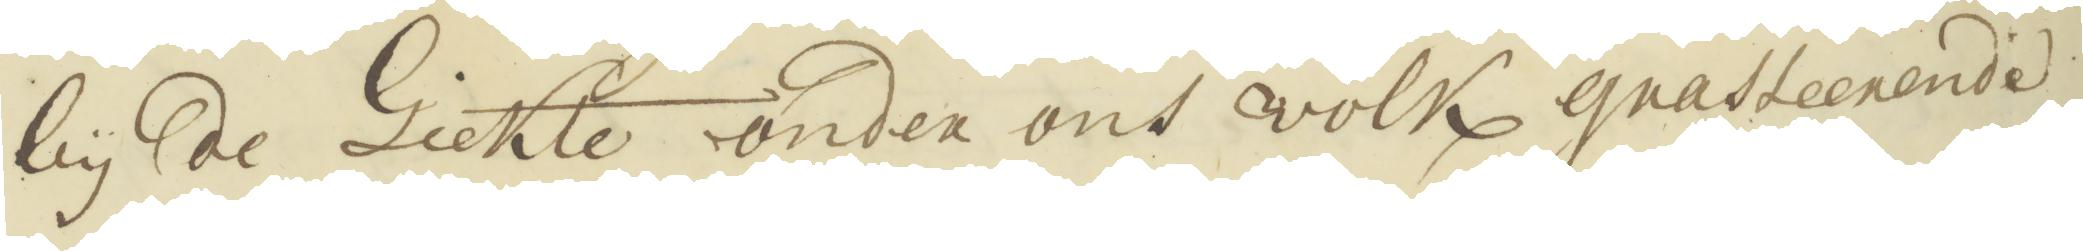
bij de ziekte onder ons volk grasseerende
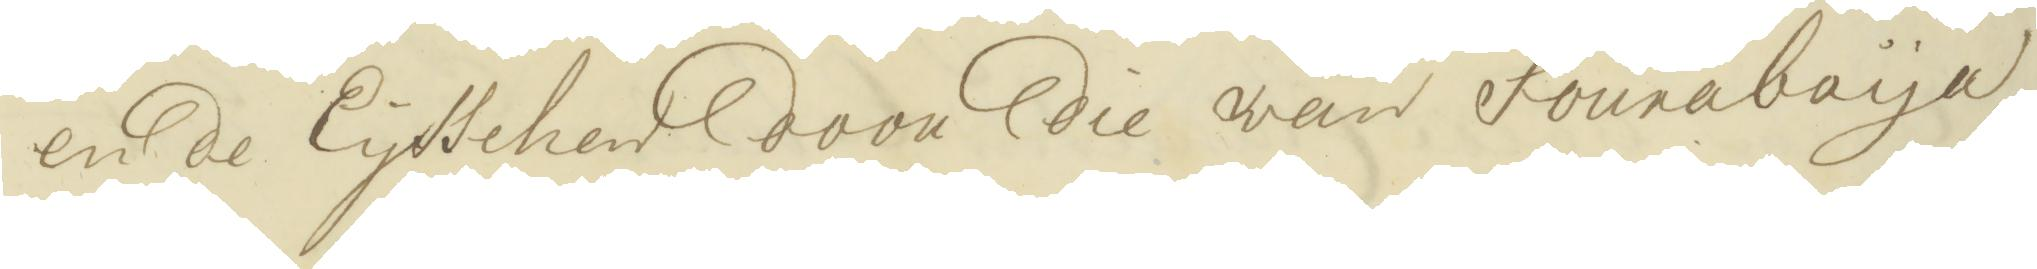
en de Eijsschen door die van sourabaija
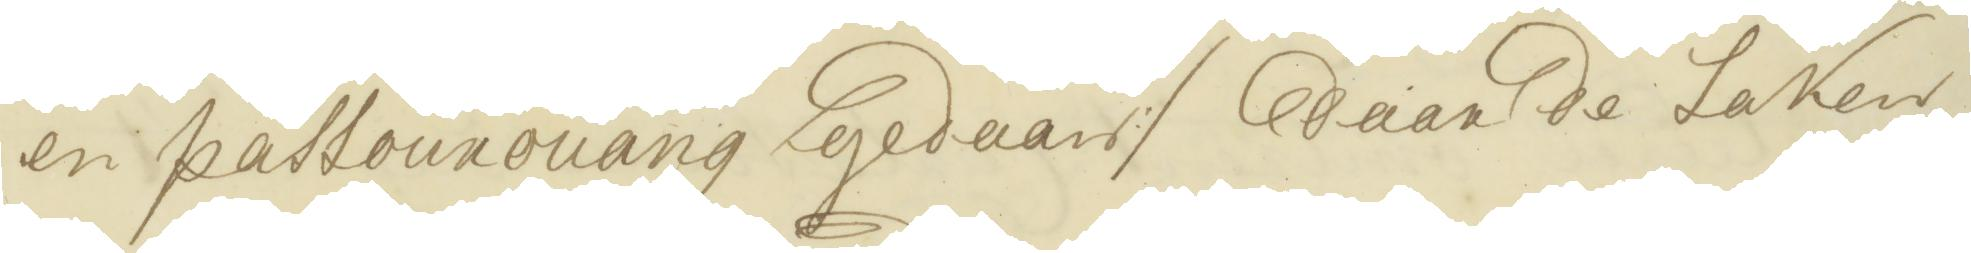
en passourouang gedaan:/ daar de zaken
